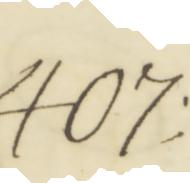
407:
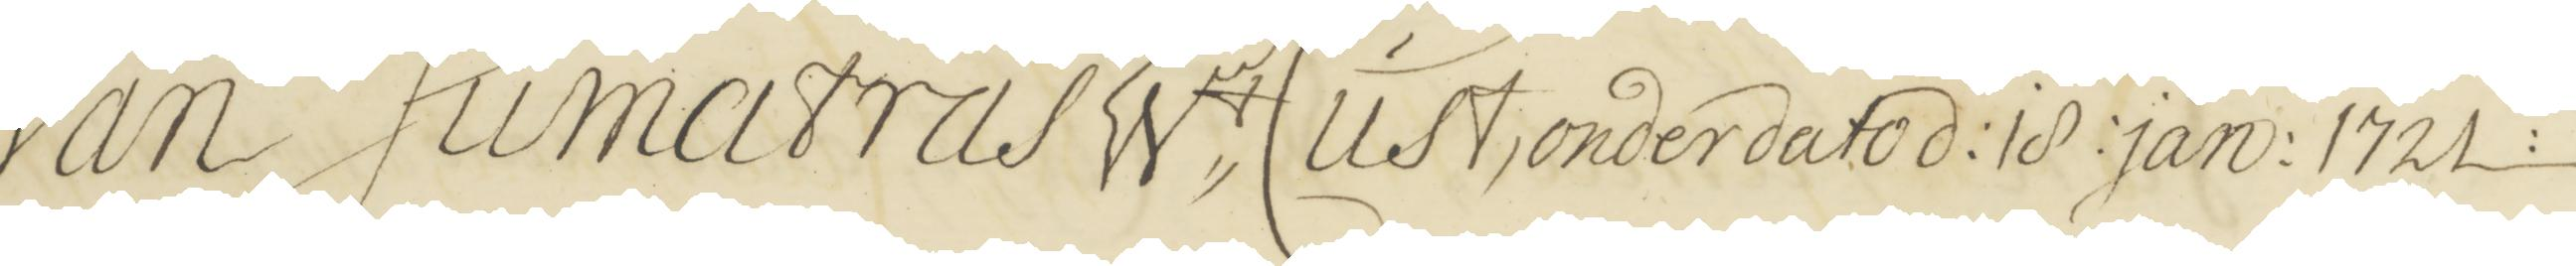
an Sumatras W„t Cust, onder dato d: 18: jan: 1721:
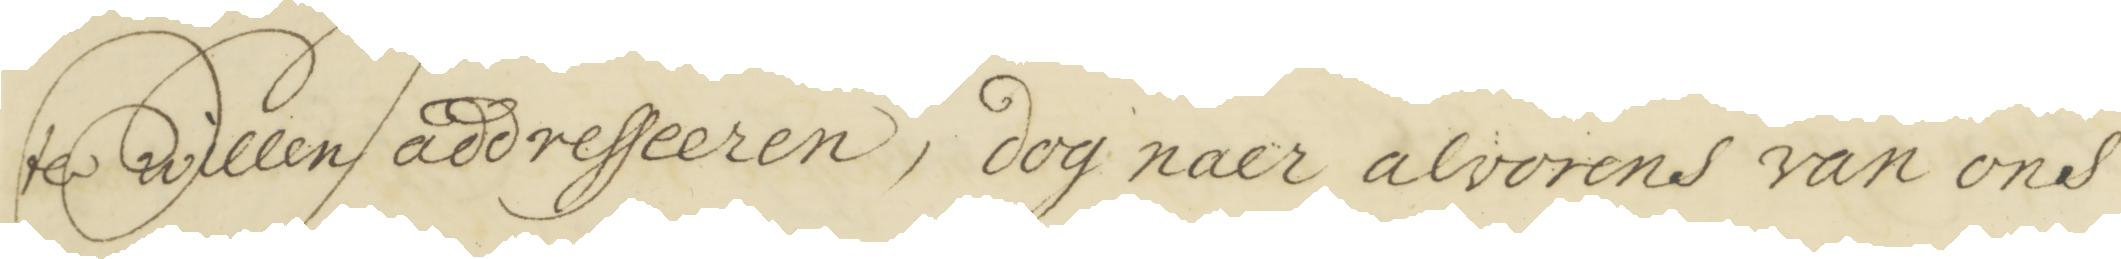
te willen addresseeren, dog naer alvorens van ons
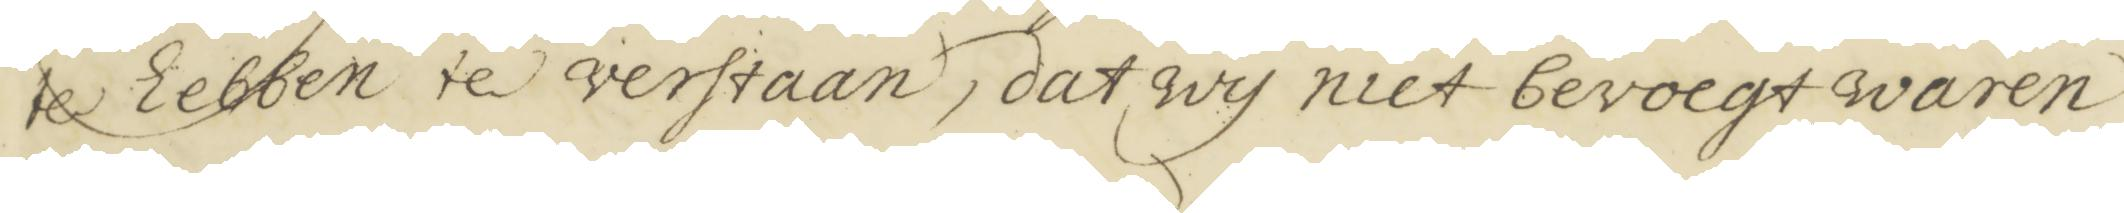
te hebben te verstaan, dat wij niet bevoegt waren
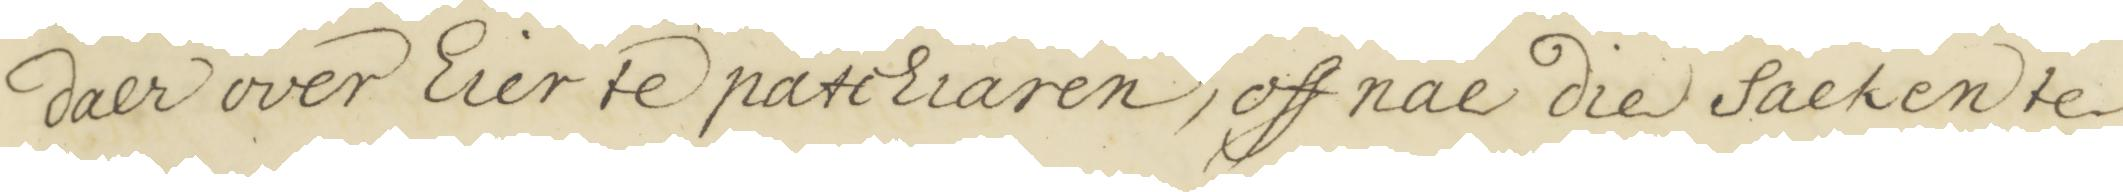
daer over hier te patchiaren, off nae die saeken te
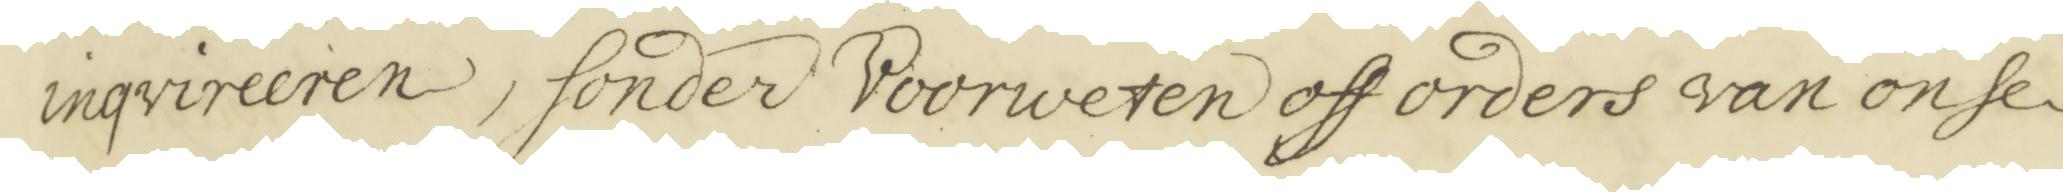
inqvireeren, sonder voorweten off orders van onse
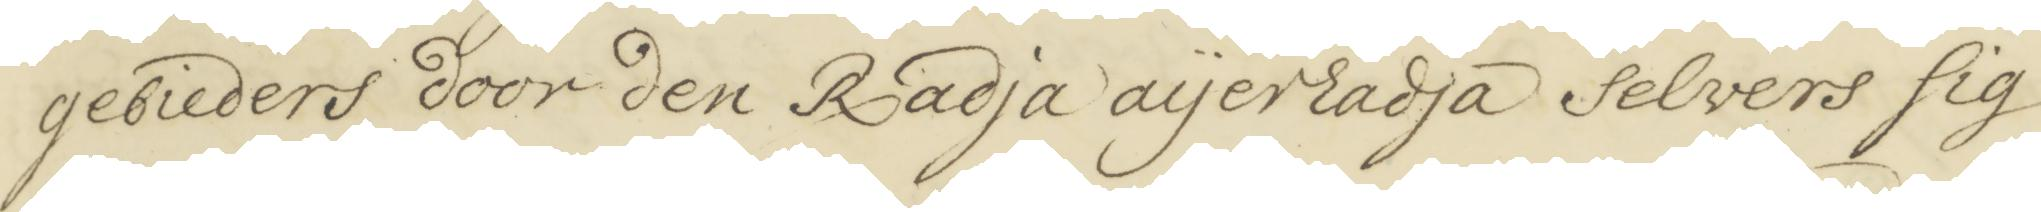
gebieders door den Radja aijerhadja selvers sig
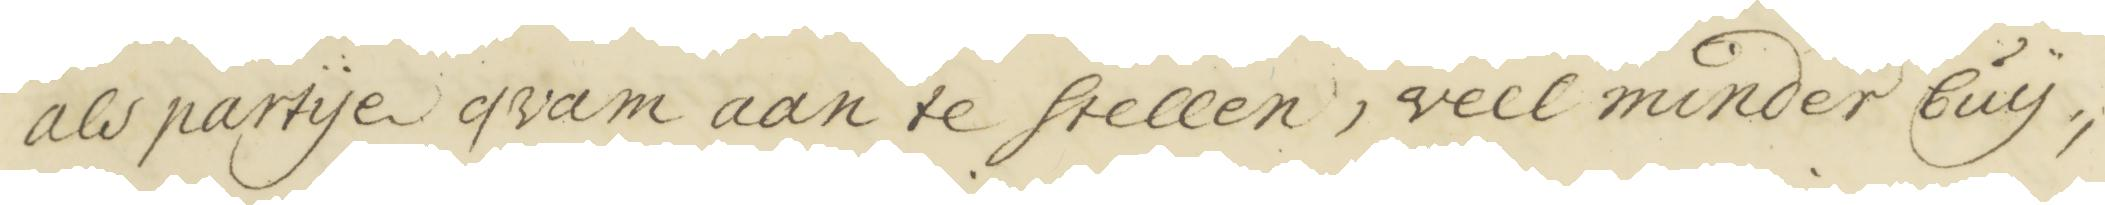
als partije qvam aan te stellen, veel minder buij„
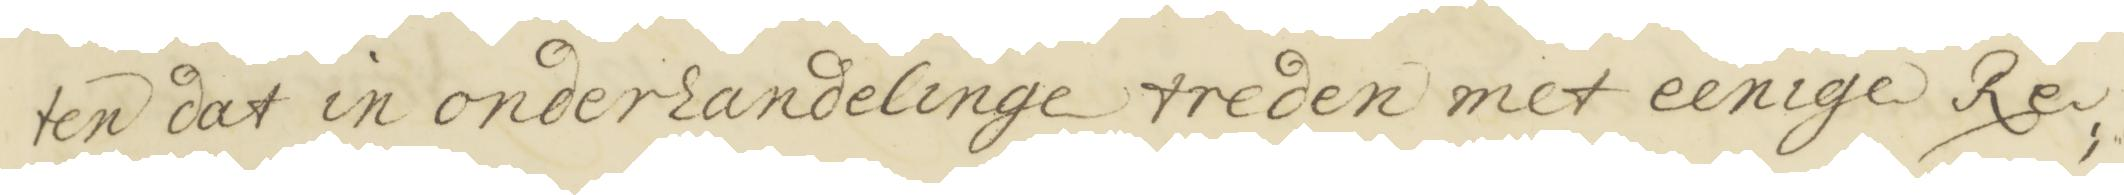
ten dat in onderhandelinge treden met eenige Re„
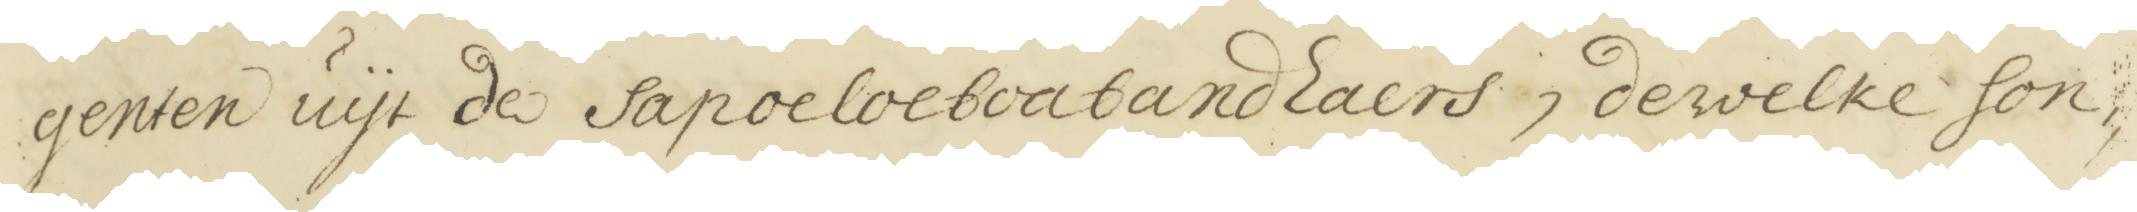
genten uijt de Sapoeloeboabandhaers, dewelke son„
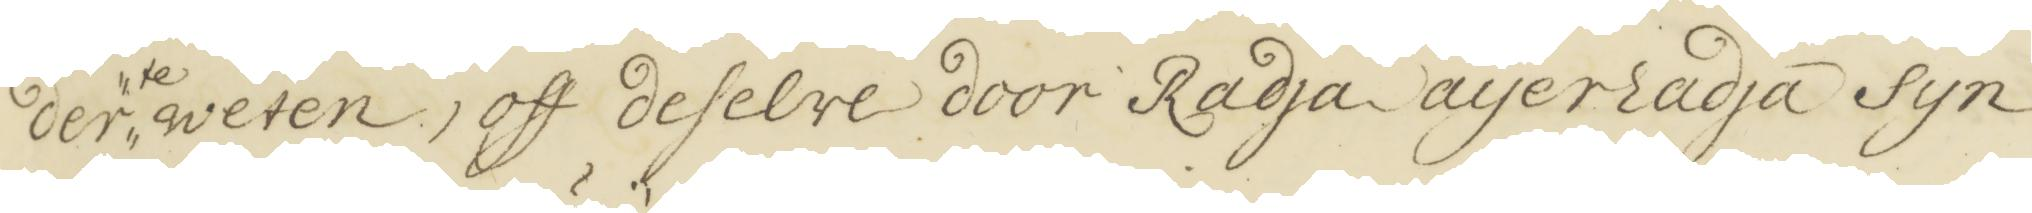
der „„te weten, off deselve door Radja aijerhadja sijn
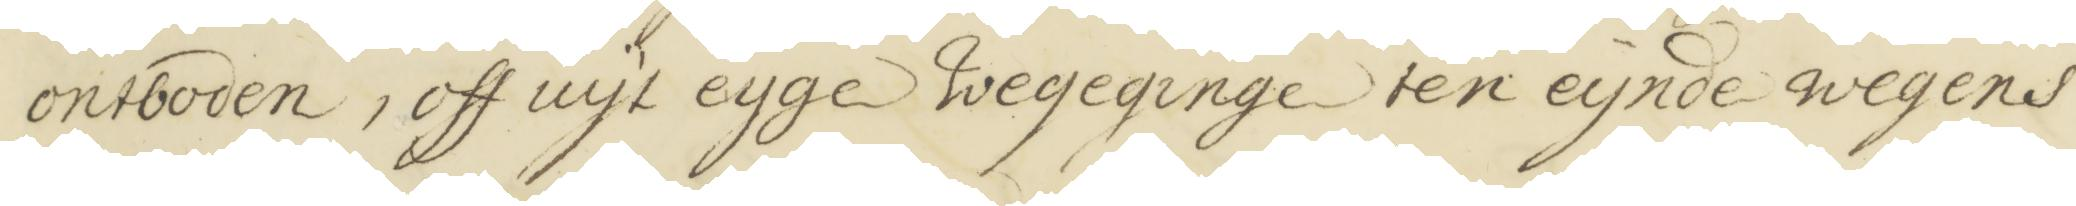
ontboden, off uijt eijge wegeginge ten eijnde wegens
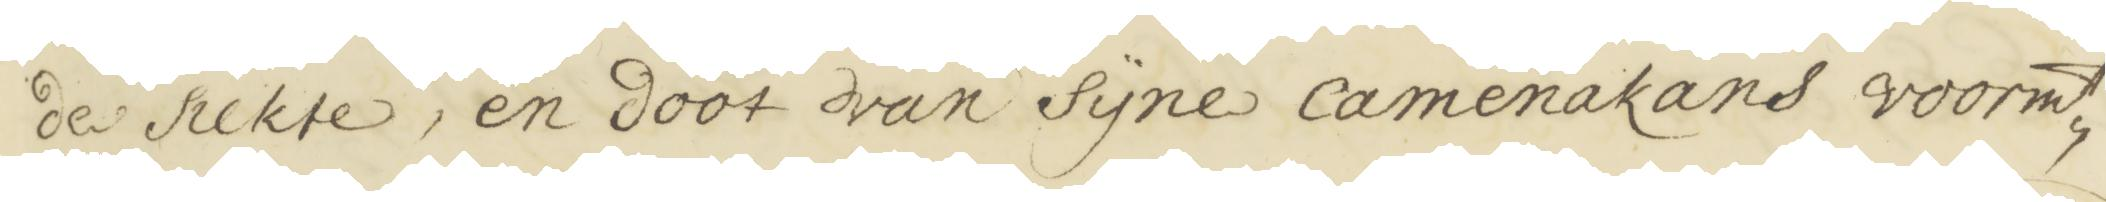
de siekte, en doot van sijne camenakans voormt„
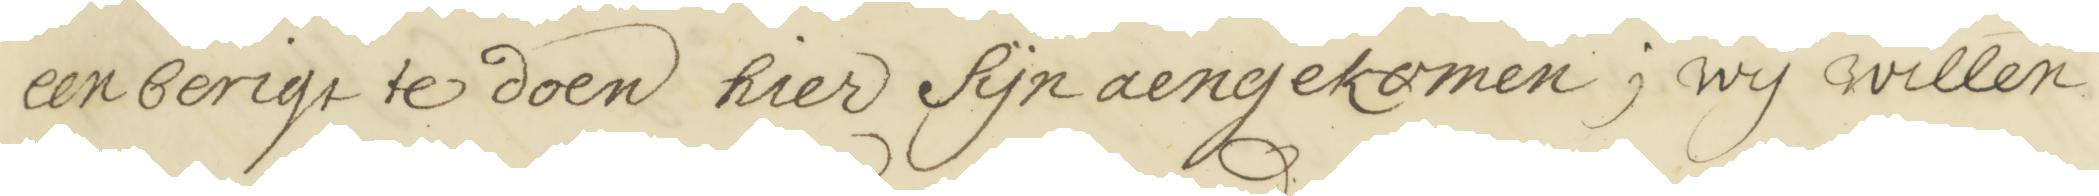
een berigt te doen hier sijn aengekomen; wij willen
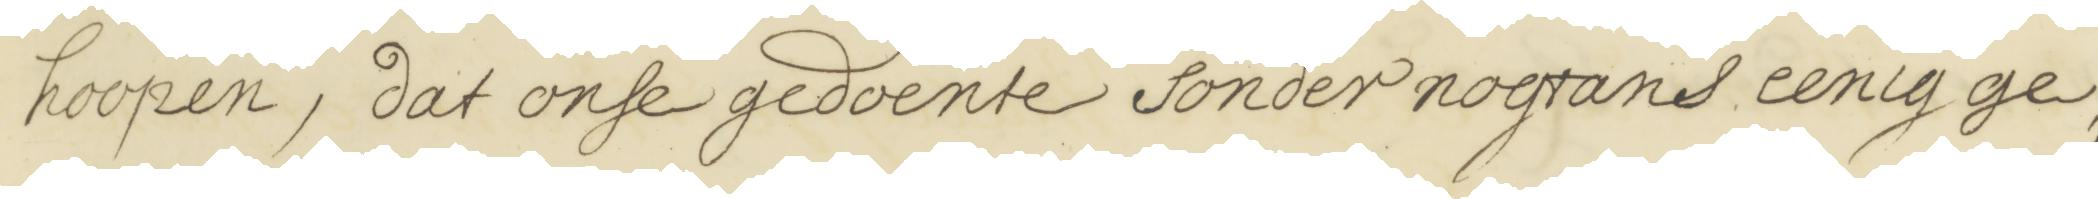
hoopen, dat onse gedoente sonder nogtans eenig ge
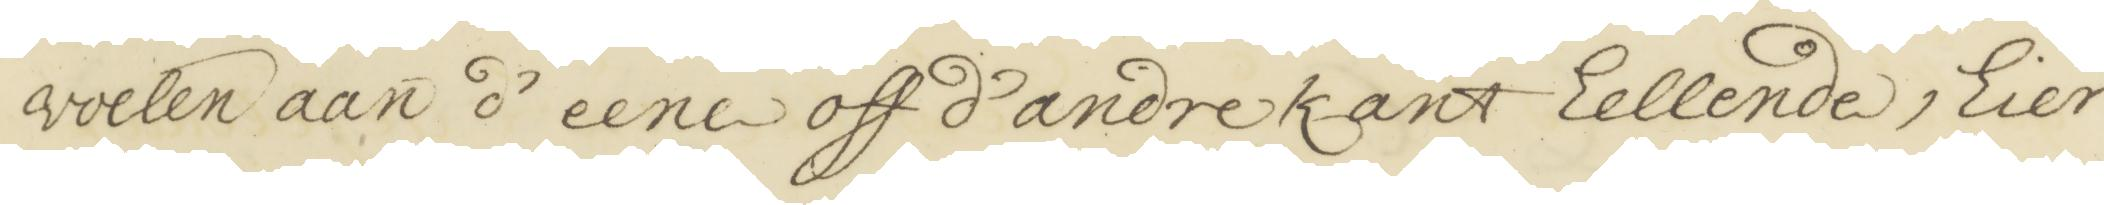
voelen aan d’ eene off d’andre kant hebbende, hier
